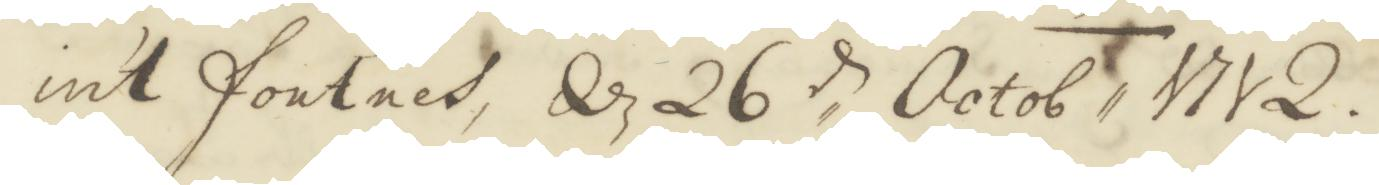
in 't fortres, den 26„en Octob„ 1712.
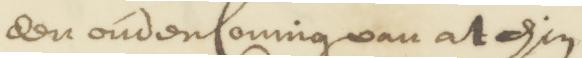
den onder Coning van atchin
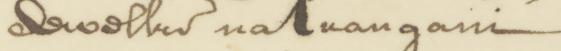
dewelke natrangani
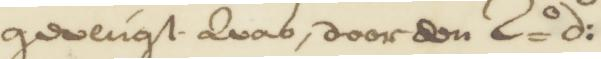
gevlugt was, door den E=e d:o
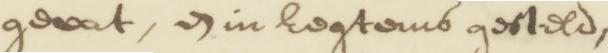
gevat, en in hegtenis gesteld,
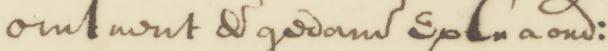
omtrent de gedane extraord:e
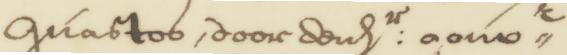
guastos, door denh:r gouv„r
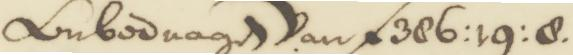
ten bedragen van ƒ386:19:8.
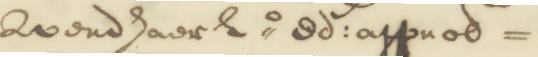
werd haer h„o Ed:s approb=e
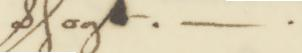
versogt.-.
